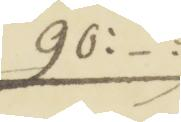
90:—:
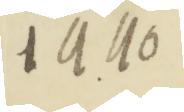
1440
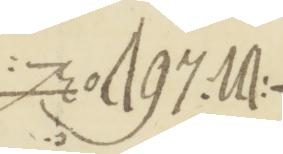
r:o 497.14:
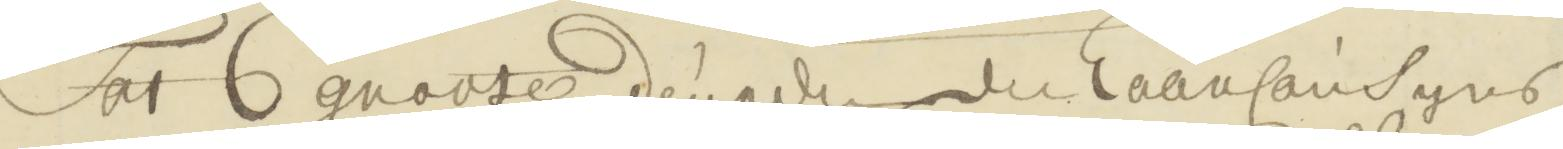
Tot 6 groote deuren en haarcousyns
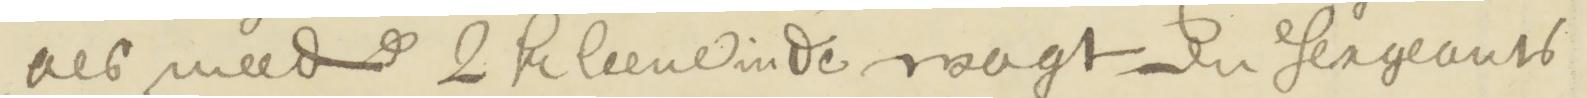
als meede 2 kleene in de wagt en sergeants
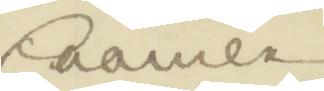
Caamer
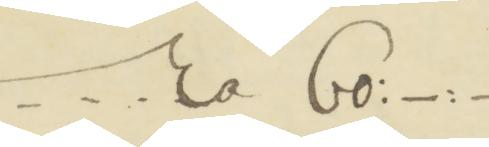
- . ro 60:—:—
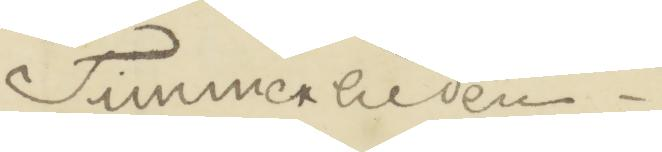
Timmerlieden -
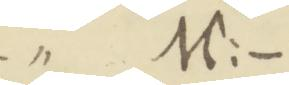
„ 15:—
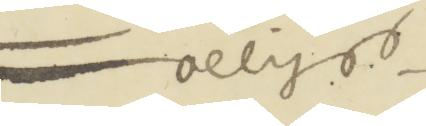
Collijs.
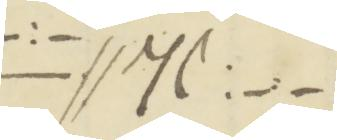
// 75:——
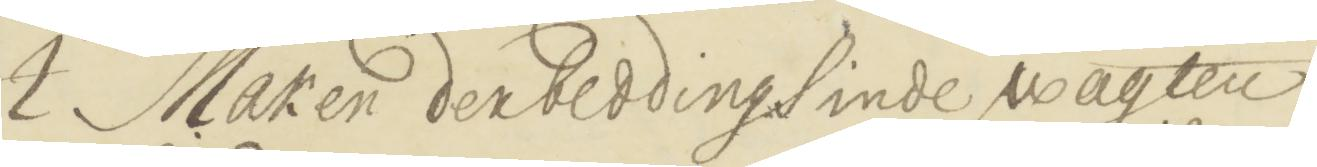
't Maken der beddings inde wagten
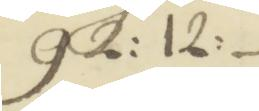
92:12:—
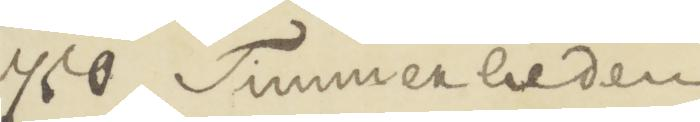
750 Timmerleden
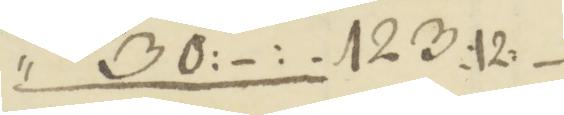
„ 30:—: — 123:12: —
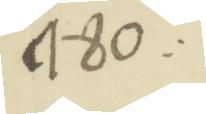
480.
